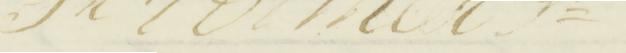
Fr. Vermeer J-r
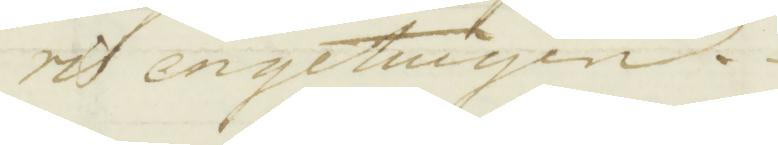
ris en getuigen.
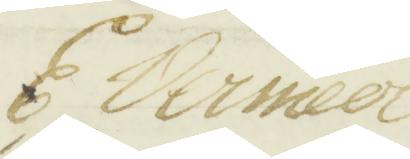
E Vermeer
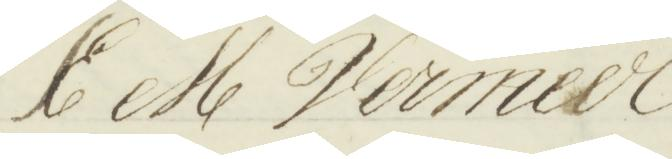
E M Vermeer
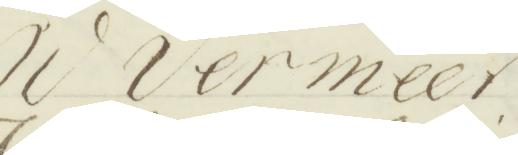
W Vermeer.
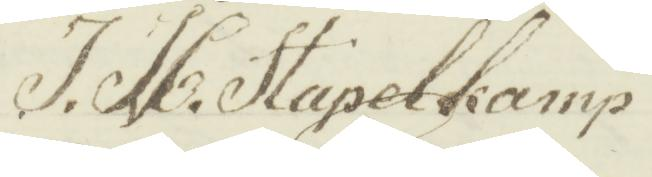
I. M: Stapelkamp
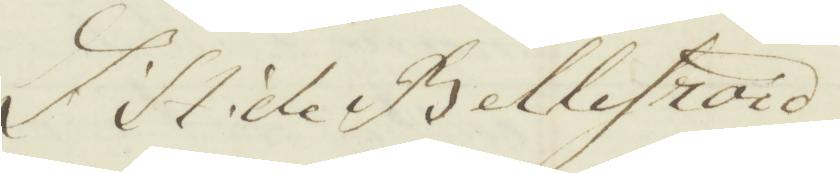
I H:de Bellefroid
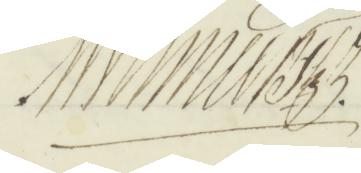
WVermeerJr
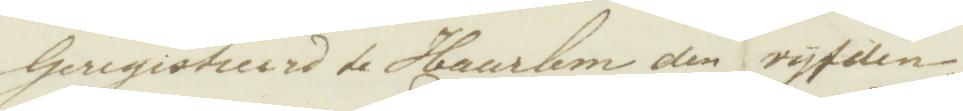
Geregistreerd te Haarlem den vijfden
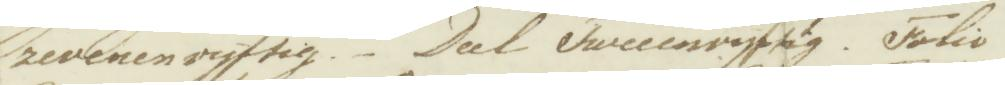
zevenenvyftig. - Deel Tweeenvyftig. Folio
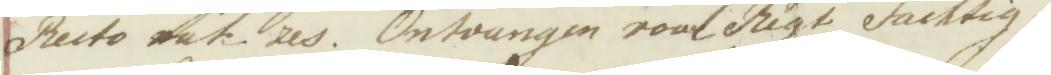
Recto vak zes. Ontvangen voor Regt Tachtig-
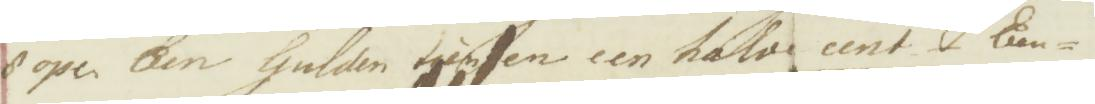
Gulden tien en een halve cent Een
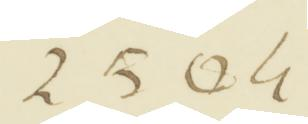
2504
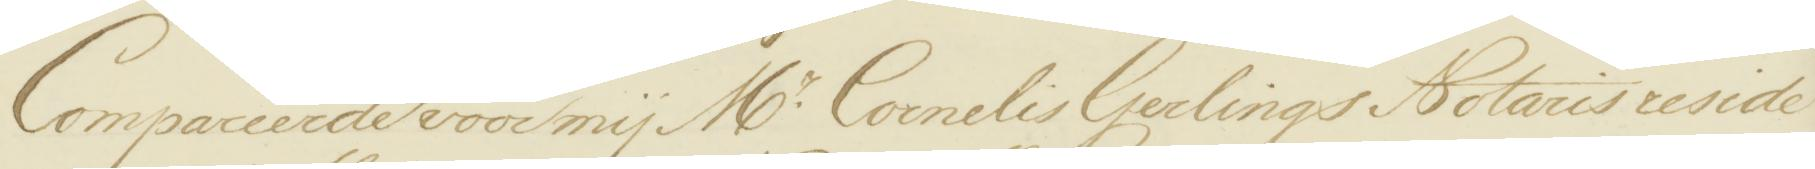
Compareerde voor mij M.r Cornelis Gerlings Notaris reside
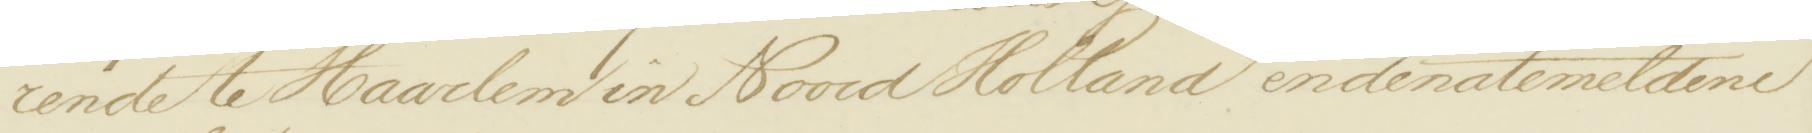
rende te Haarlem in Noord Holland en de natemeldene
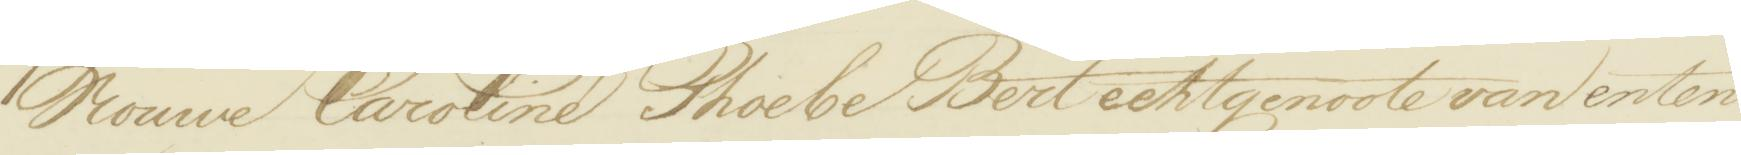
Vrouwe Caroline Phoebe Bert echtgenoote van en ten
